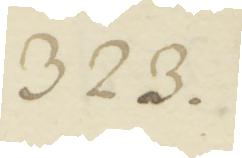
323.
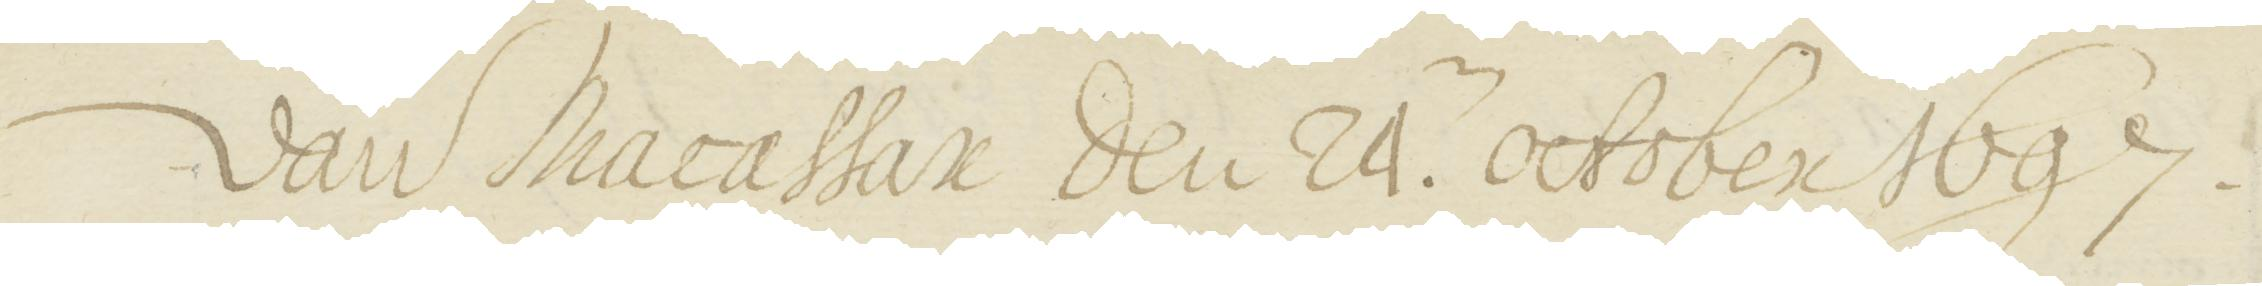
Van Macassar den 24.' october 1697
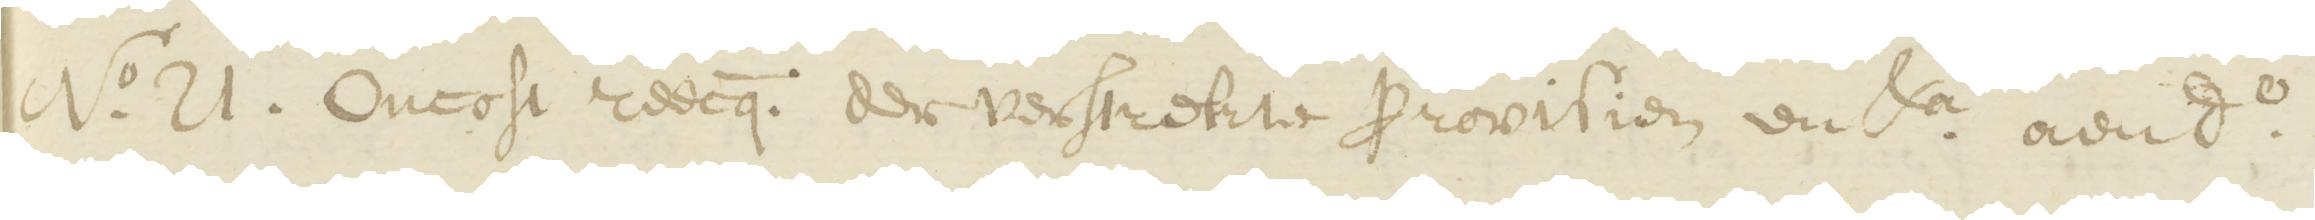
N=o 21. Oncost reecq: der verstrekte provisien en &a aen d.o
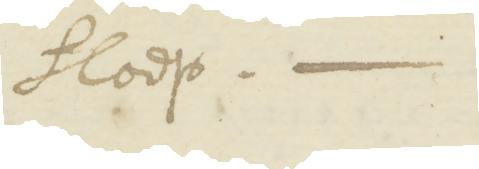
sloep. -
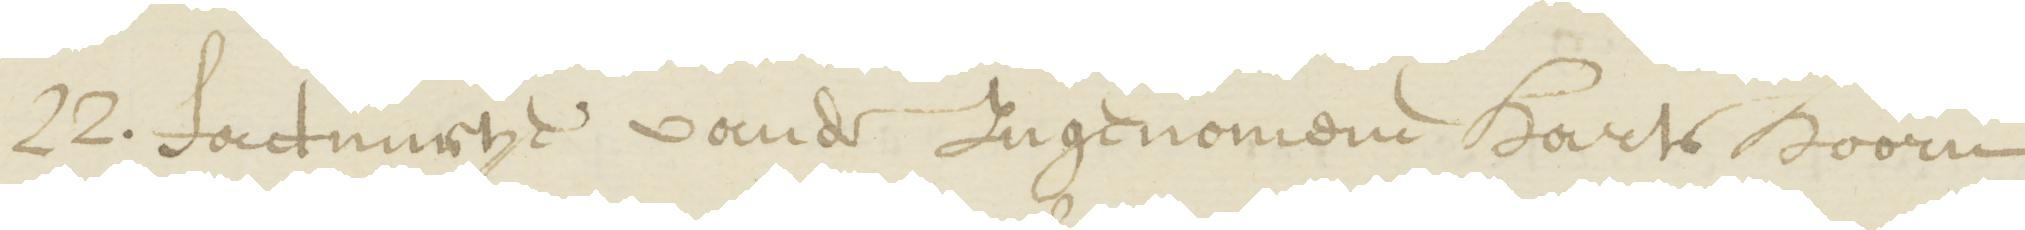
22. factuurtje vande Ingenomene harts hoorn
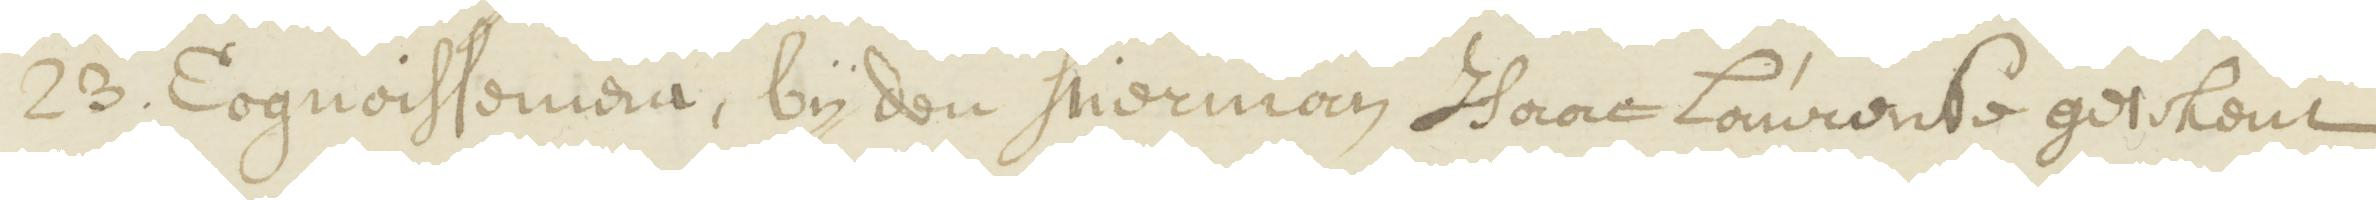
23. Cognoissement, bij den stierman Isaac Laurense getekent
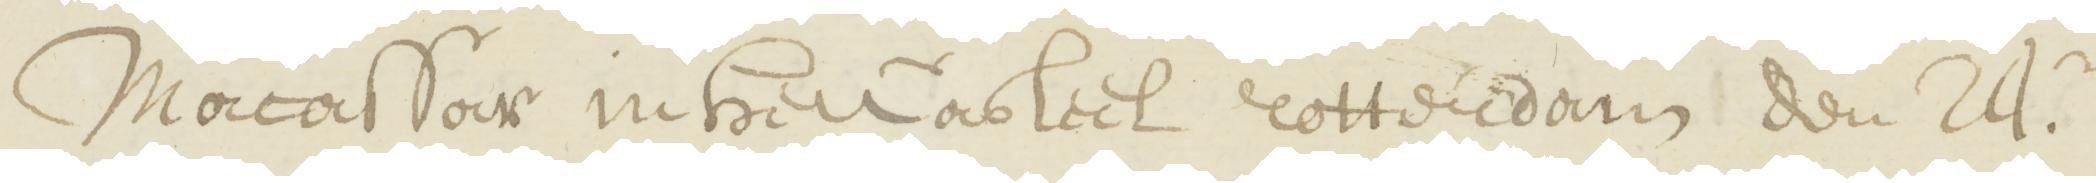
Macassar in het Casteel rotterdan den 24:
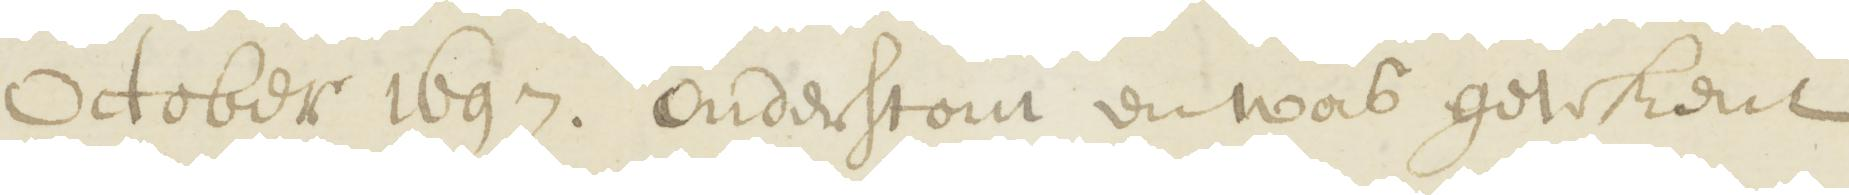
October 1697. onderstont en was getekent
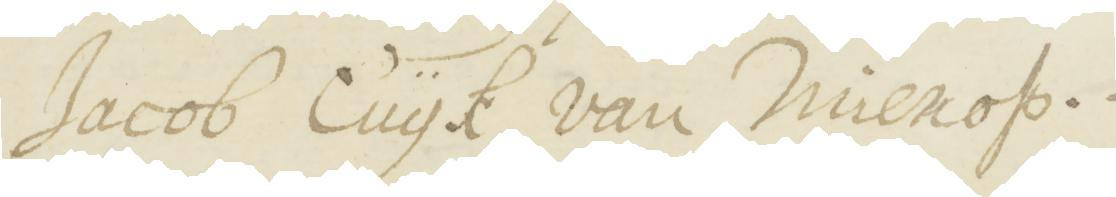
Iacob Cuijk van Mierop.
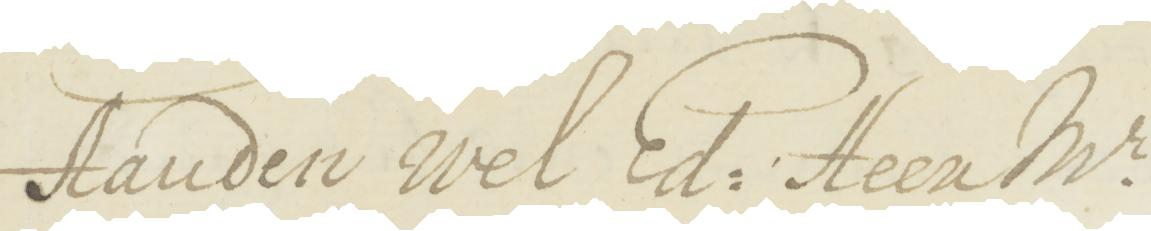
Aanden wel Ed: Heer M:r
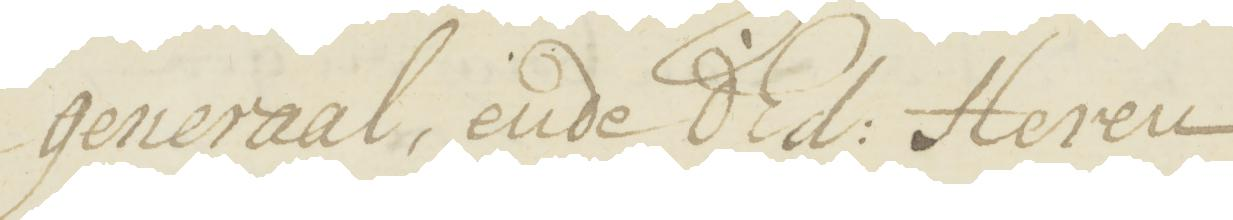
generaal, ende d'Ed: Heren
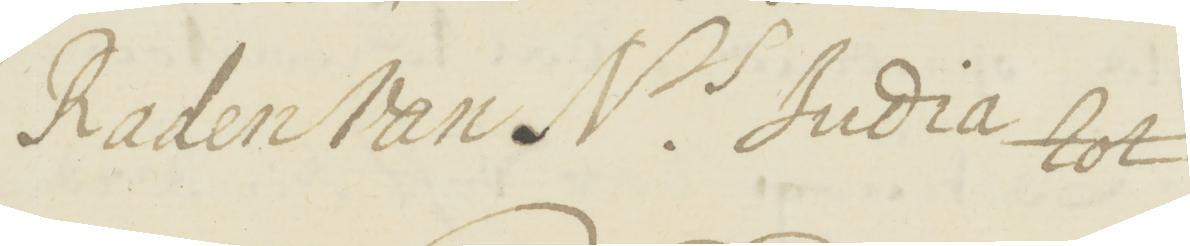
Raden van N.s India„ tot
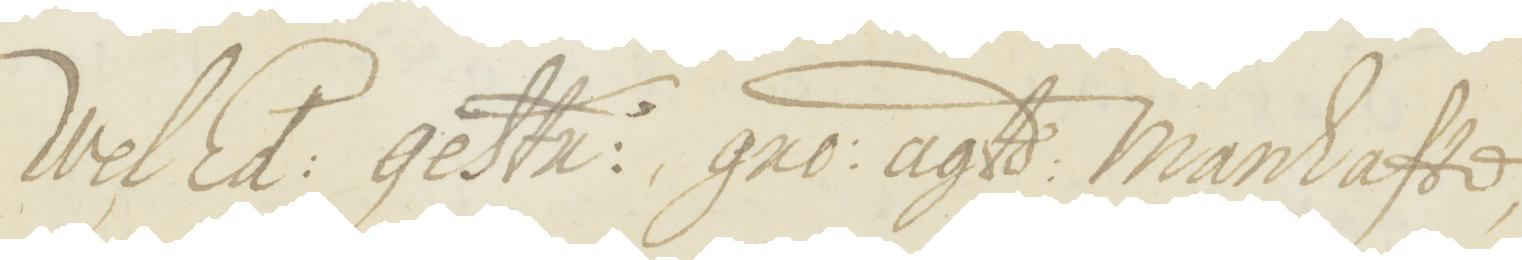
Wel Ed: gesthr:e, gro: agtb: Manhafte,
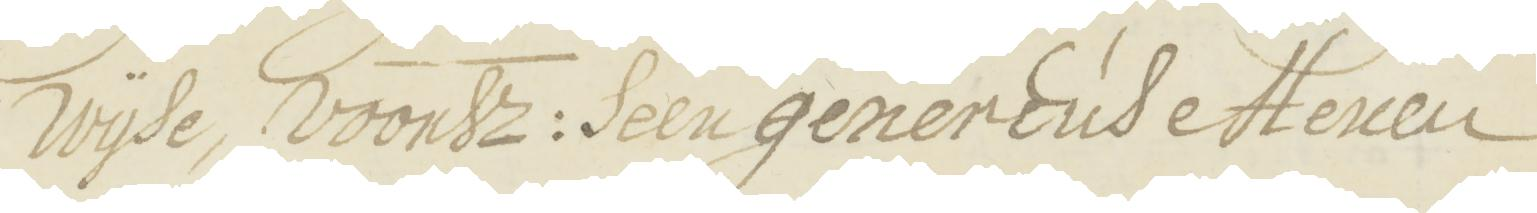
wijse, voorsz: seer genereuse Heren
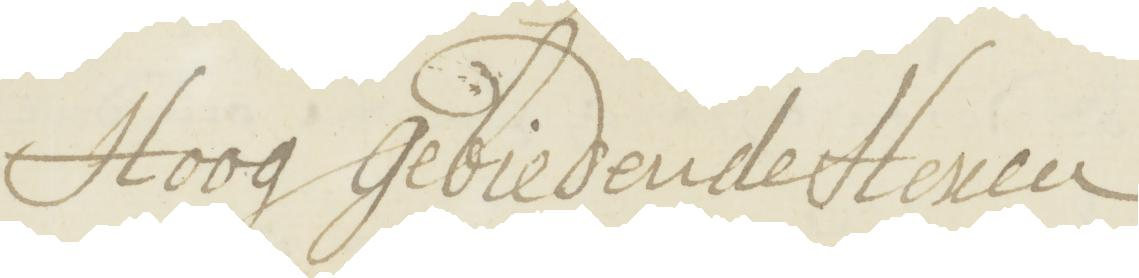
Hoog gebieden de Heren
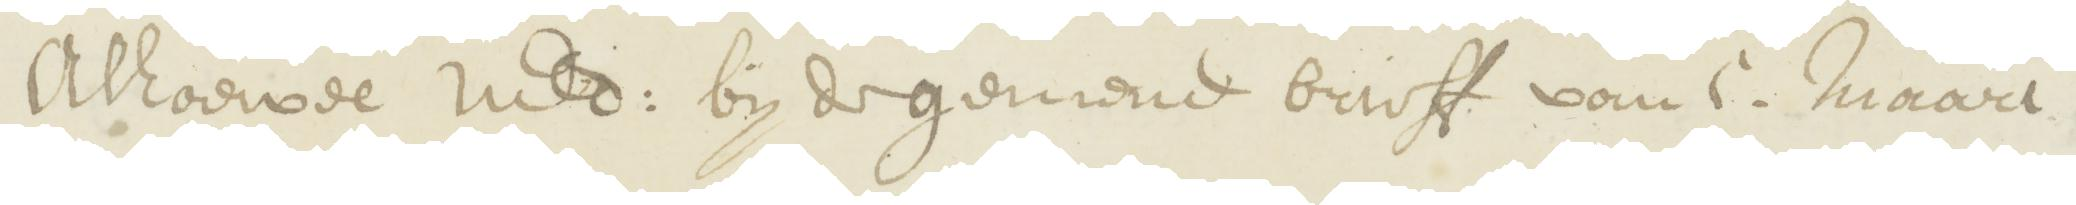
Alhoewel UEd: bij de gemene brieff van 5. Maart
